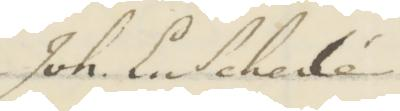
Joh. Enschedé
